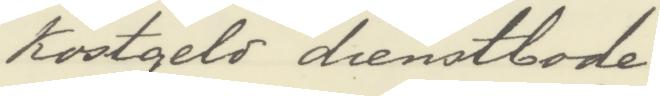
Kostgeld dienstbode
